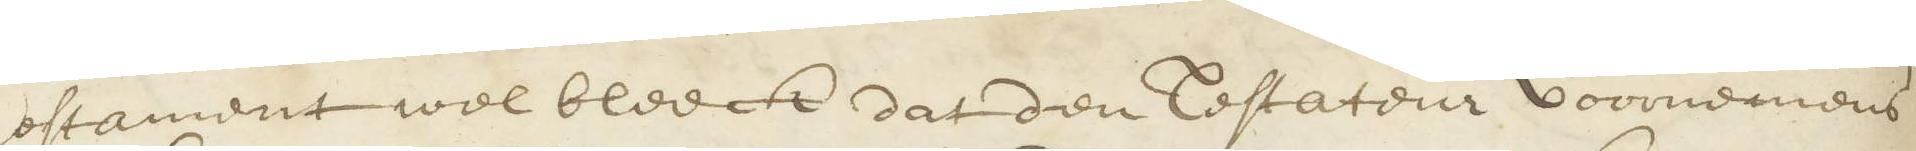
Testament wel bleeck dat den Testateur voornemens
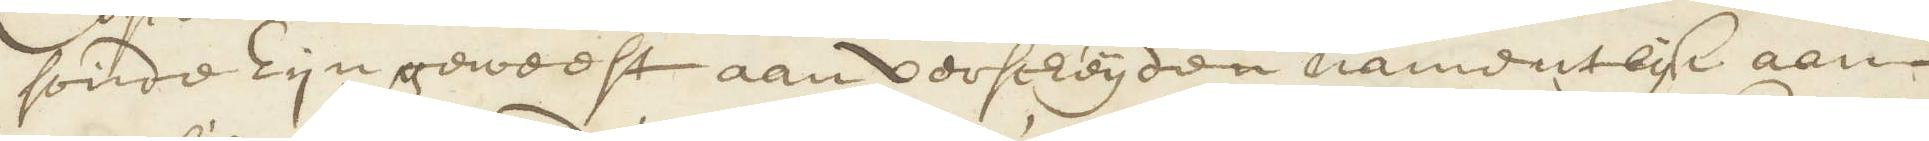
soude zijn geweest aan verscheijden namentlijk aan
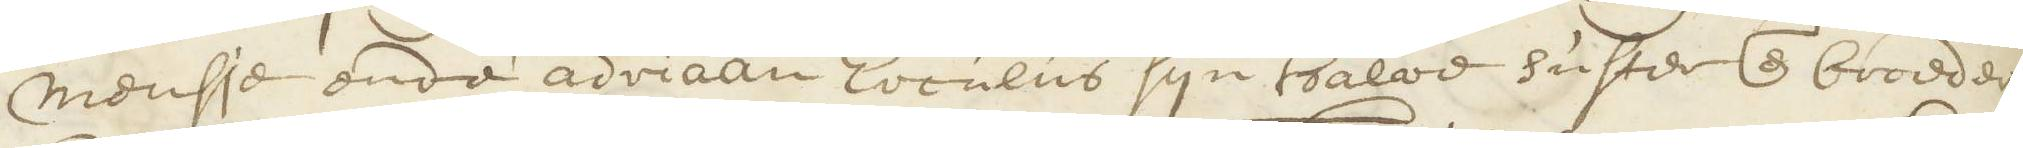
mensje oude adriaan zoculus sijn halve suster ende broeder
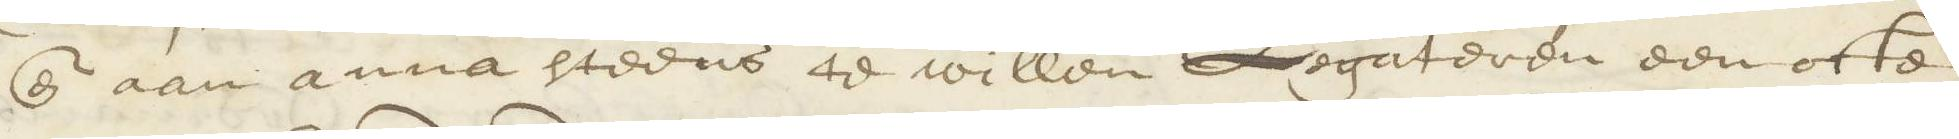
ende aan anna steens te willen Legateren een ofte
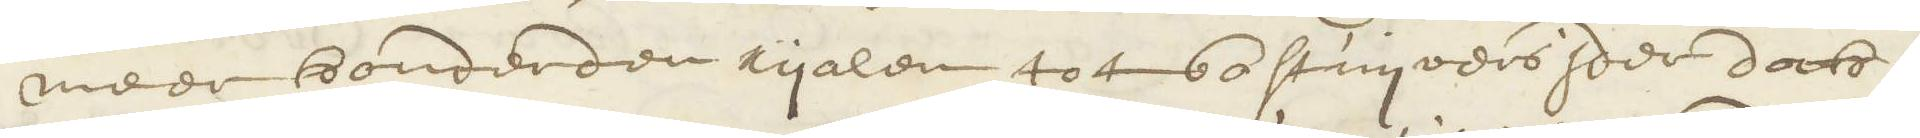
meer honderden rijalen tot 60 stuijvers jder doch
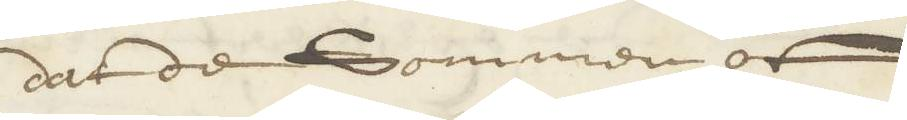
dat de Sommen offte de quantiteijt van de selve
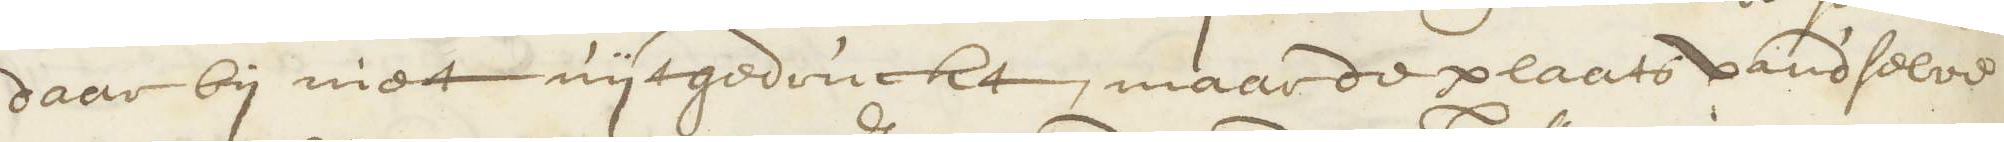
daar bij niet uijtgedruckt, maar de plaats vand' selve
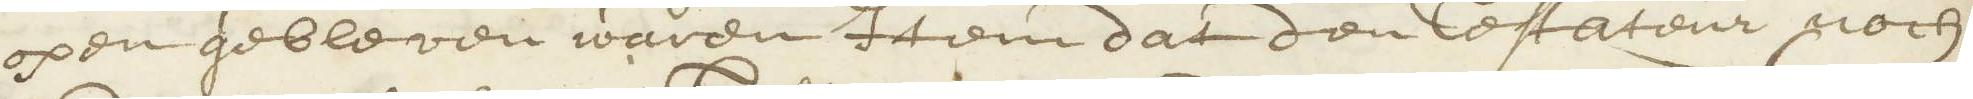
op en gebleven waren Jtem dat den Testateur noch
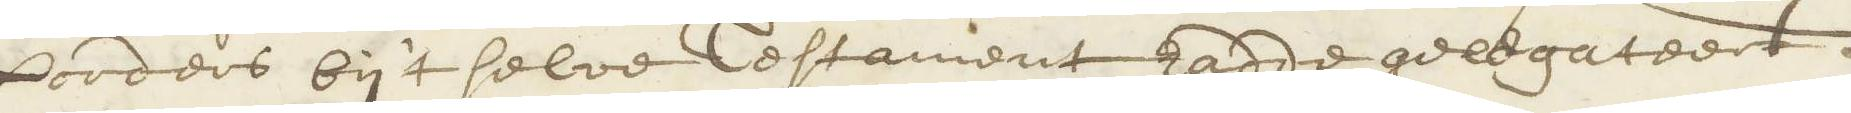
vorders bij ’t selve Testament hadde gelegateert.
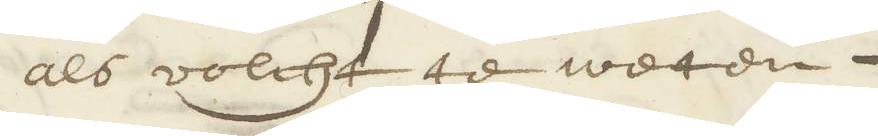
als volcht te weten -
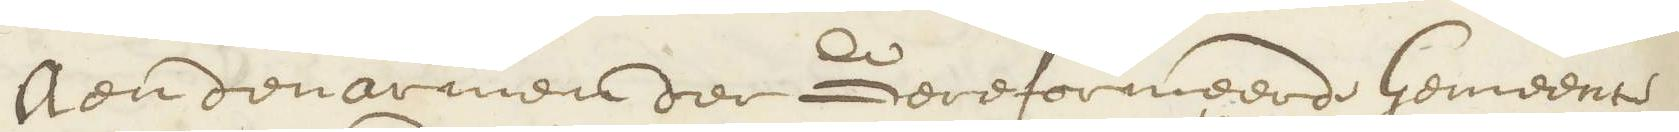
Aen den armen der Gereformeerde Gemeente
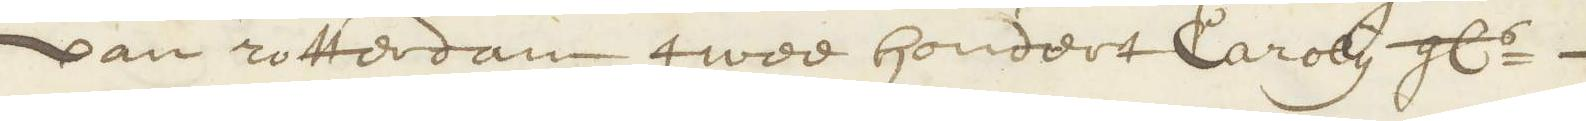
van rotterdam twee hondert Carolij gl=s —
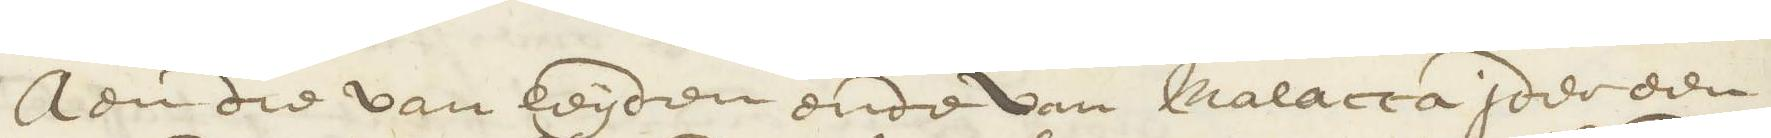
Aen die van leijden ende van Malacca jder een
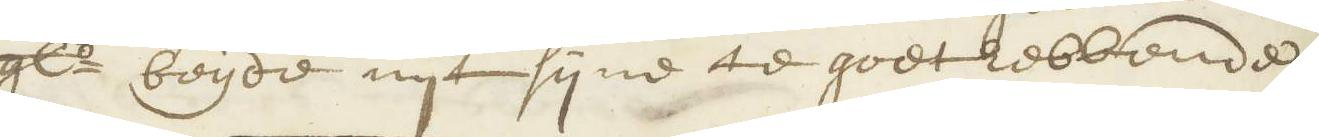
gl=s beijde uijt sijne te goet hebbende
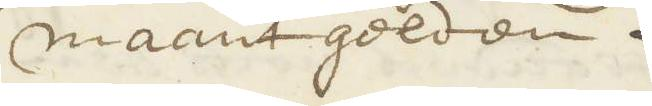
maant gelden -
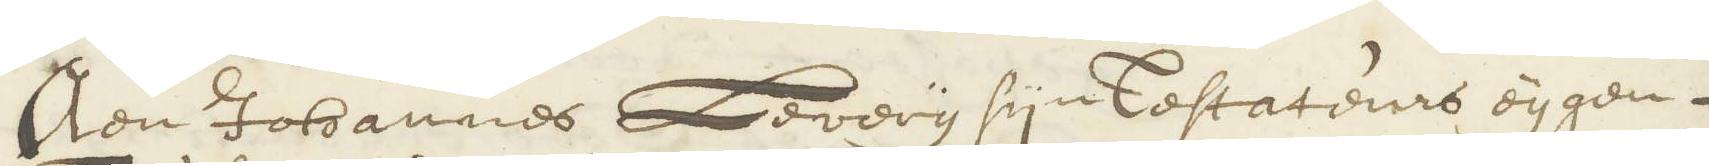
Aen Johannes Leverij sijn Testateurs eijgen
